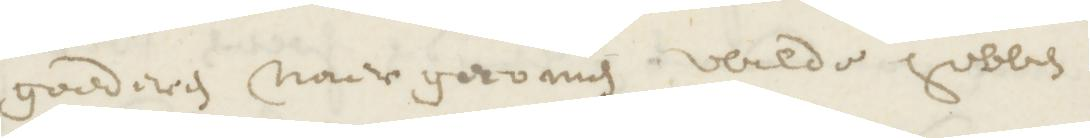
goederen naer gecomen wilde hebben
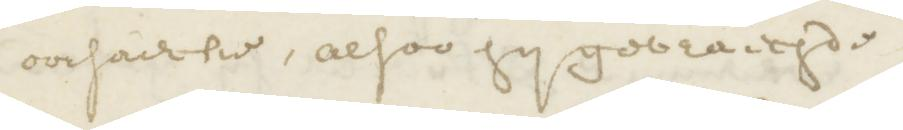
oorsaecke, alsoo hy gevraechde
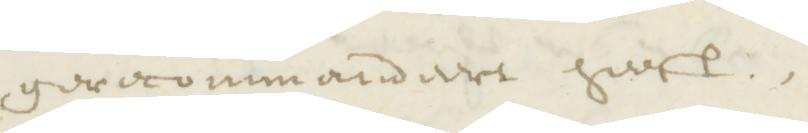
gerecommandeert heeft. ,
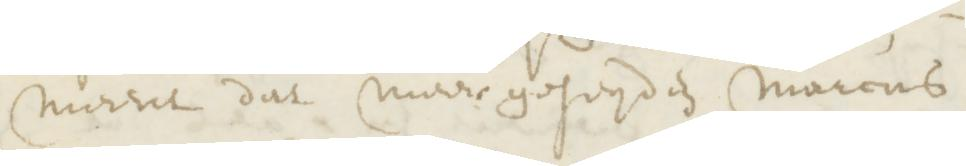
meent dat meer gesegden marcus
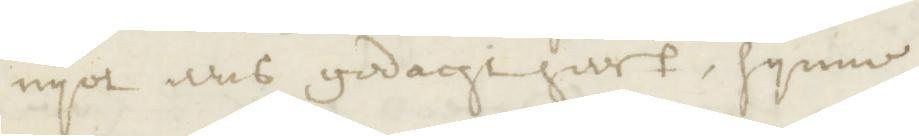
nyet eens gedacht heeft, synne
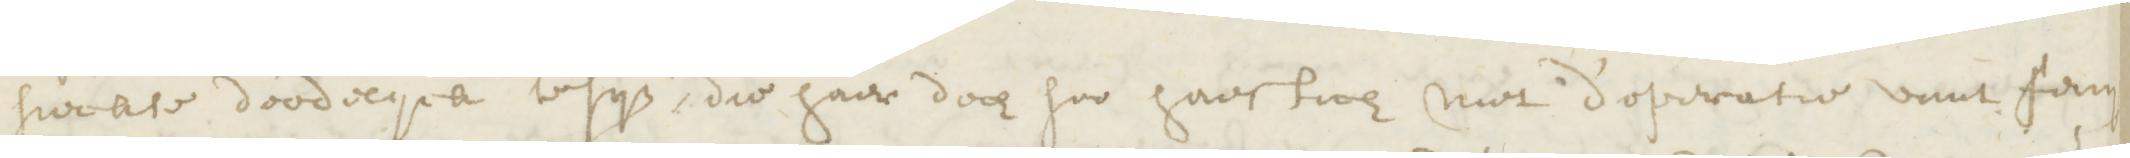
sieckte doodelyck te syn, die haer doch soo haestich met d'operatie vant fem
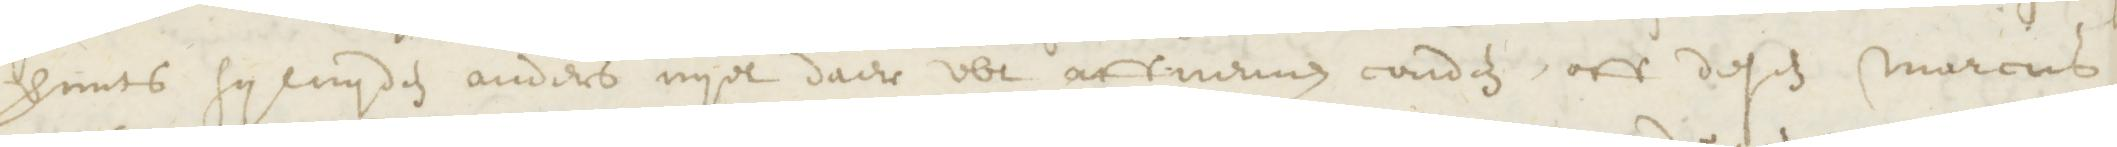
vermits syluyden anders nyet daer wt affnemen conden, off desen marcus
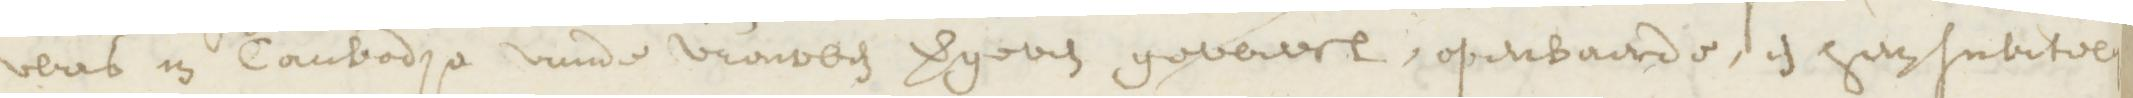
was in Cambodja vande vrouwen vergeven geweest, openbaarde, en hem Inbitel
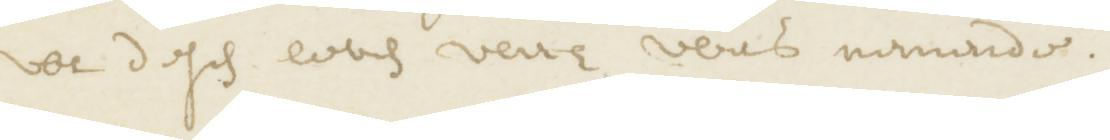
wt desen leven wech was nemende.
